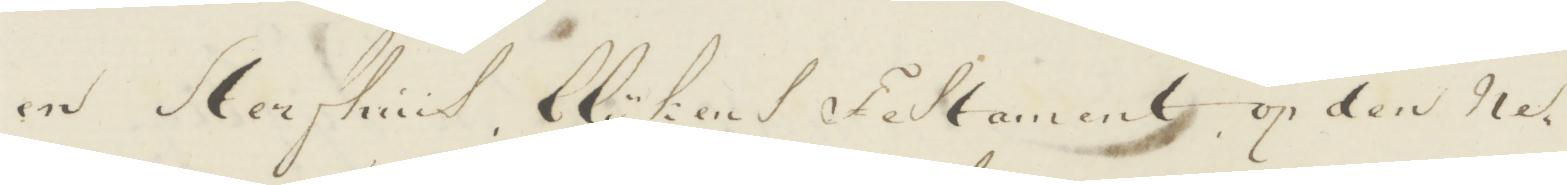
en sterfhuis, blijkens Testament op den Ne„
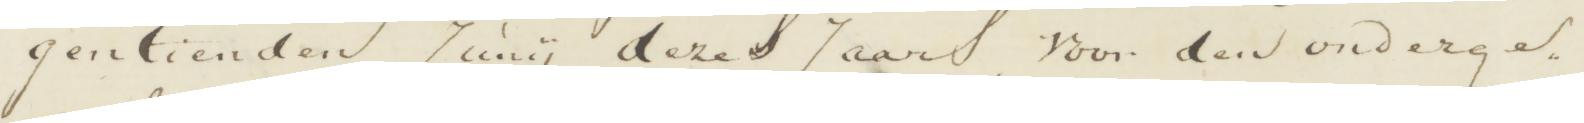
gentienden Junij dezes Jaars voor den onderge„
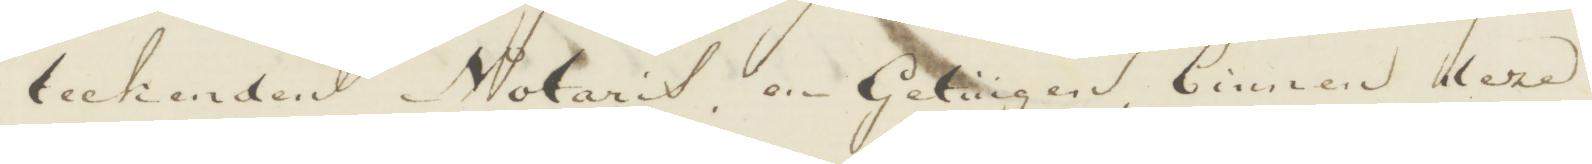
teekenden Notaris, en Getuigen binnen deze
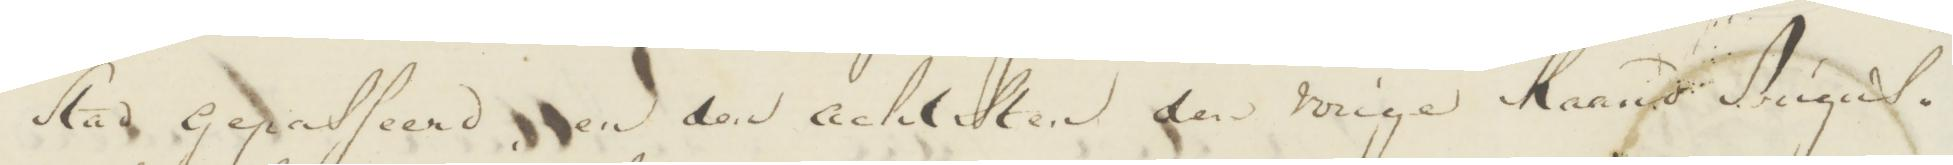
stad gepasseerd,en den achtsten der vorige Maand Augus„
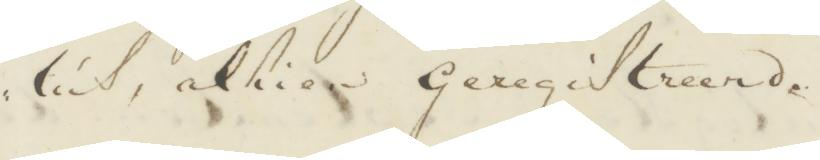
„tus, alhier Geregistreerd.
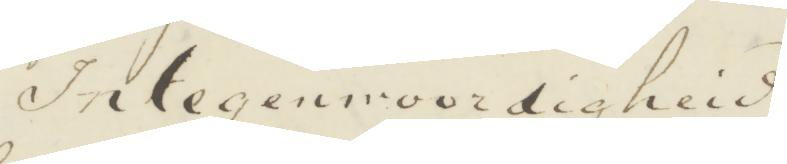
Integenwoordigheid
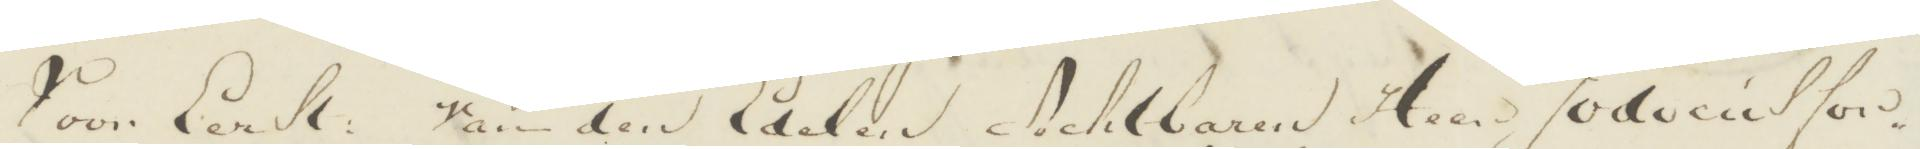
Voor Eerst: van den Edelen Achtbaren Heer Jodocus Cor„
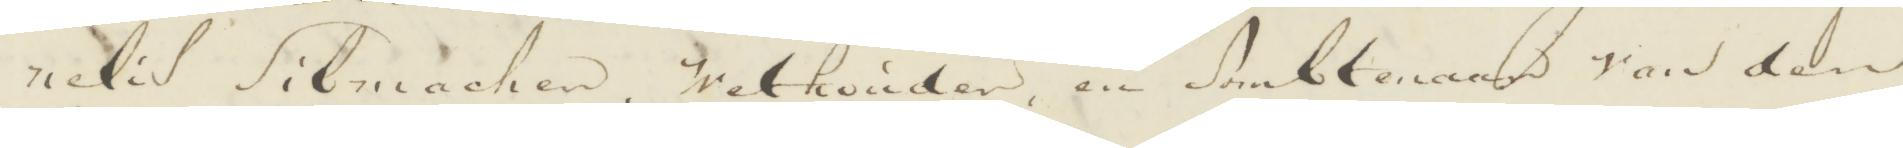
nelis Silmacher, wethouder, en Ambtenaar van den
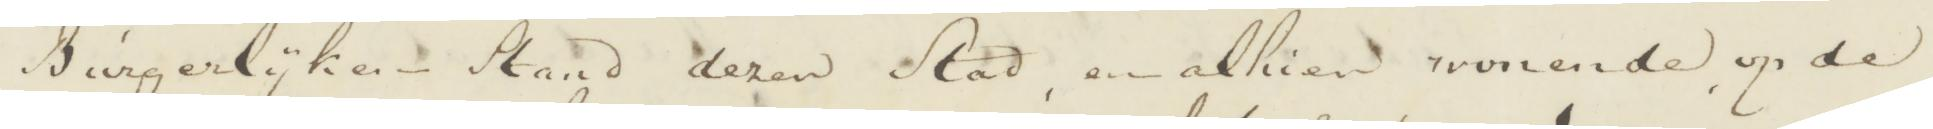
Burgerlijken stand dezer stad en alhier wonende, op de
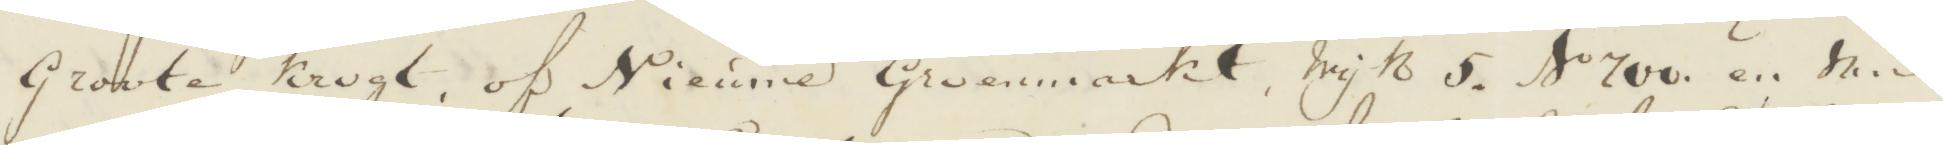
Groote krogt, of Nieuwe Groenmarkt, wijk 5 No 700. en den
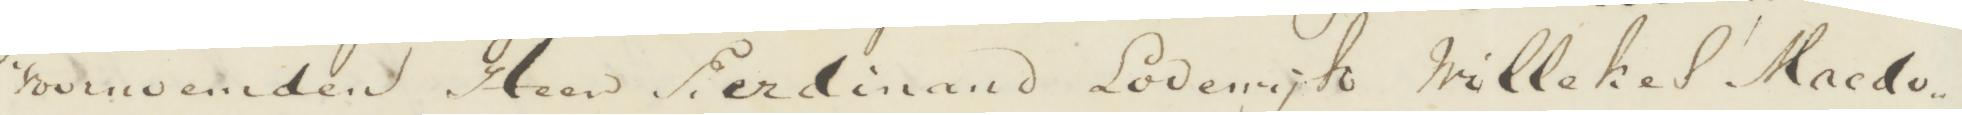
voornoemden Heer Ferdinand Lodewijk Willekes Macdo„
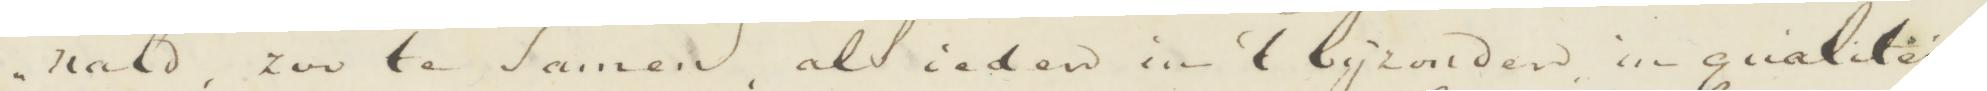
„nald, zoo te samen, als ieder in ’t bijzonder, in qualiteit
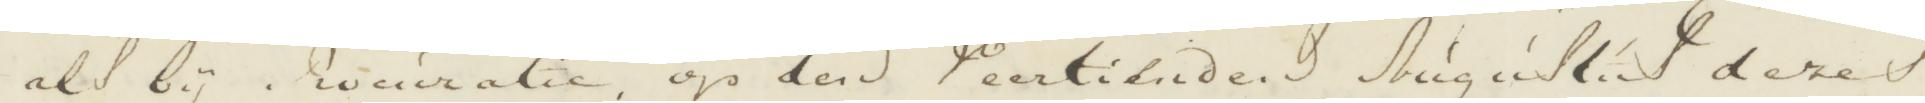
als bij Procuratie op den Veertienden Augustus dezes
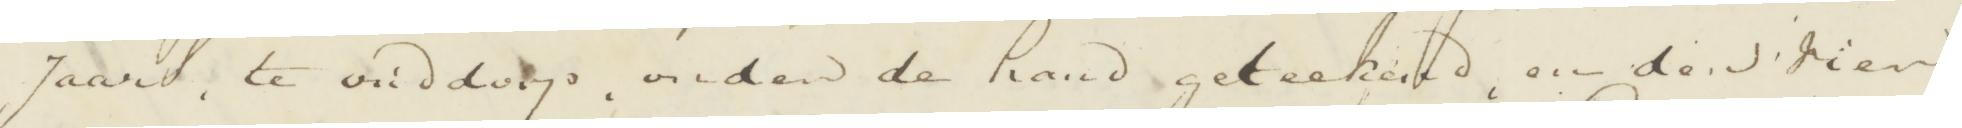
Jaars, te ouddorp onder de hand geteekend, en den vier
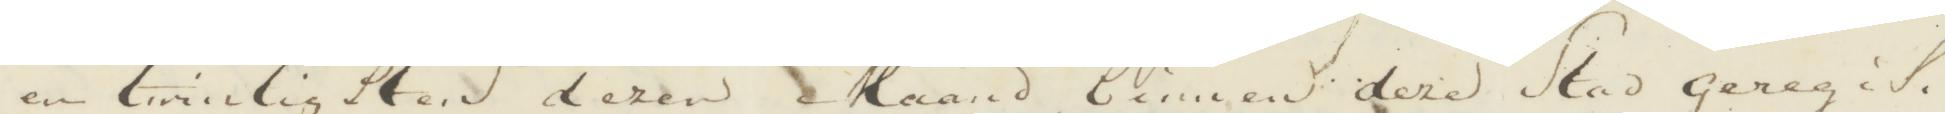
en twintigsten dezer Maand, binnen deze Stad geregis„
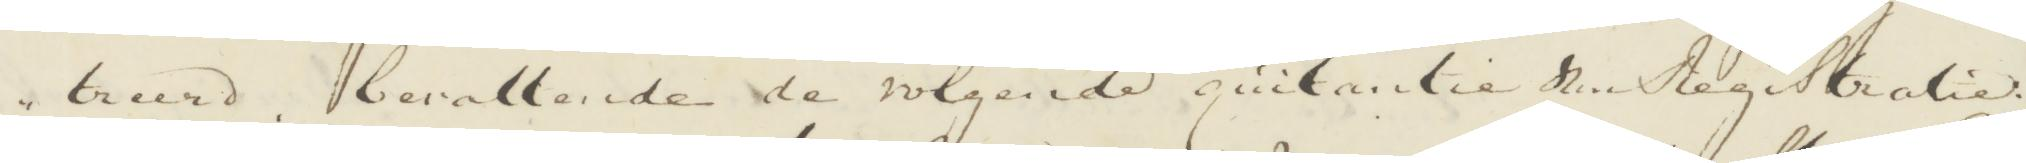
„treerd, bevattende de volgende quitantie van Registratie:
